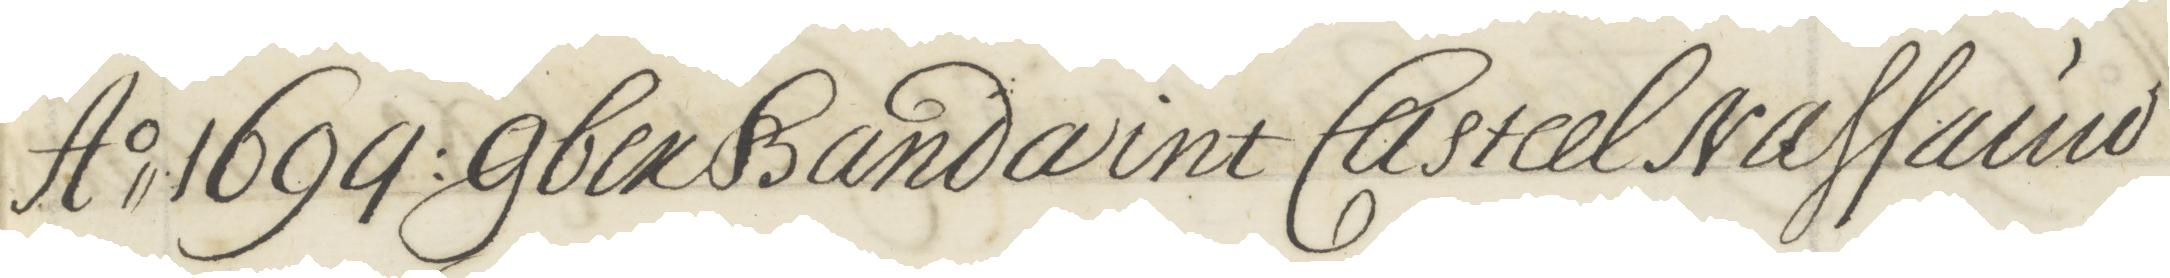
A„o 1694: gber banda int Casteel nassauw
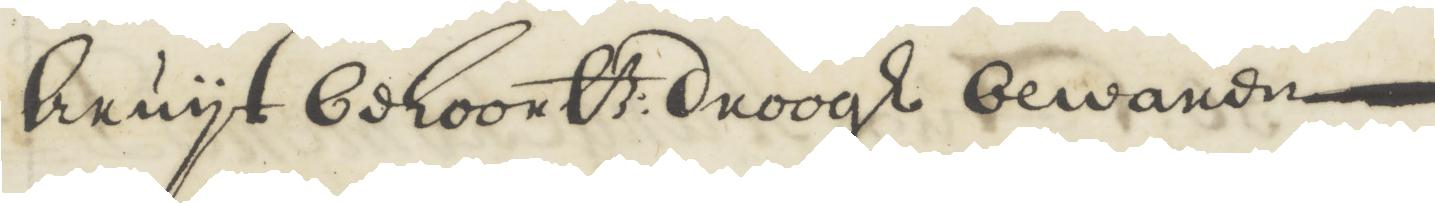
kruijt behoorlijk droogh bewaren
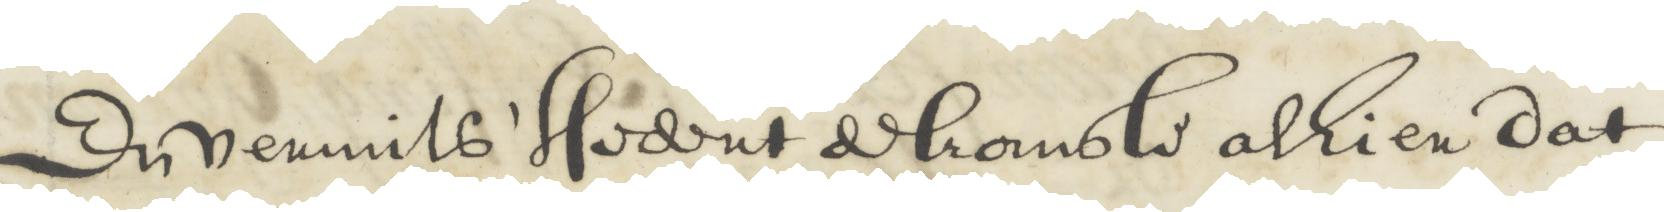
En vermits 't sedert dekomste alhier dat
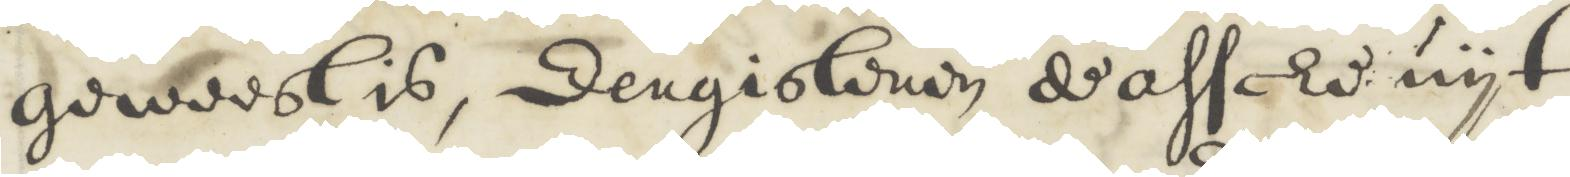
geweest is, Eergisteren de assche uijt
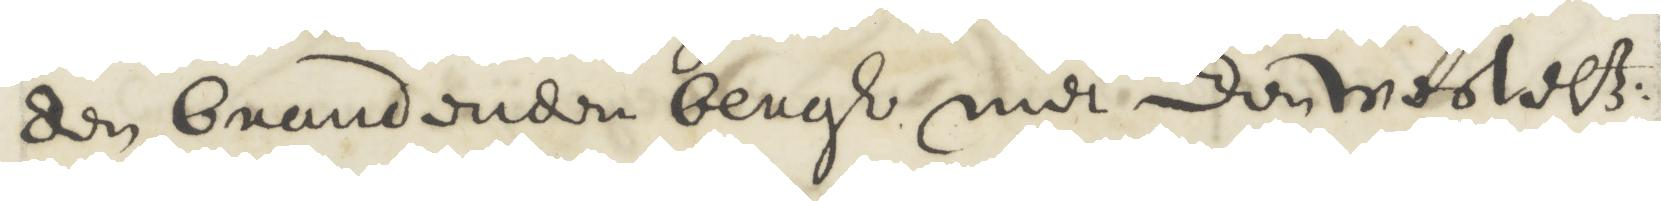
den brandenden bergh met Een westelijk
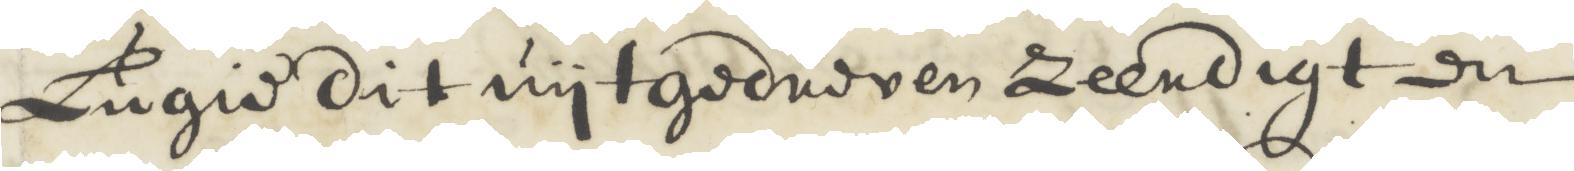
Lugie dit uijtgedreven zeerdigt en
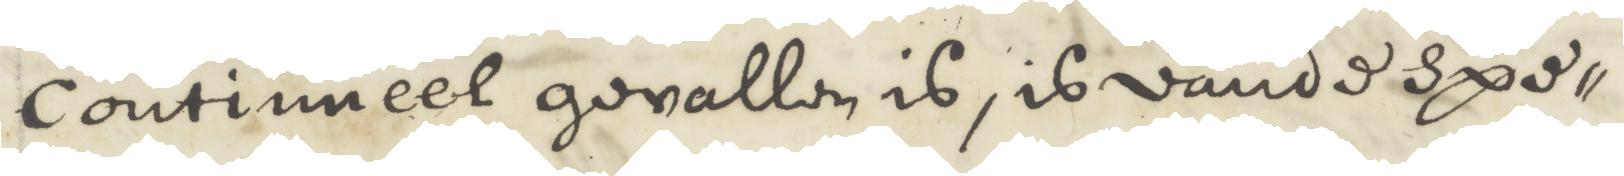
continueel gevallen is, is vande spe„
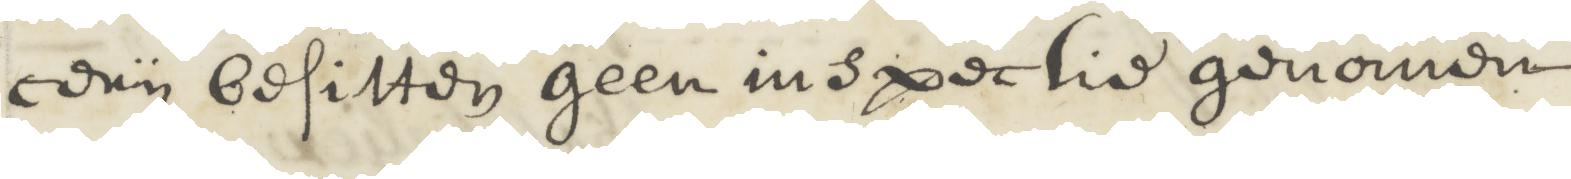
cerij besitter geen inspectie genomen
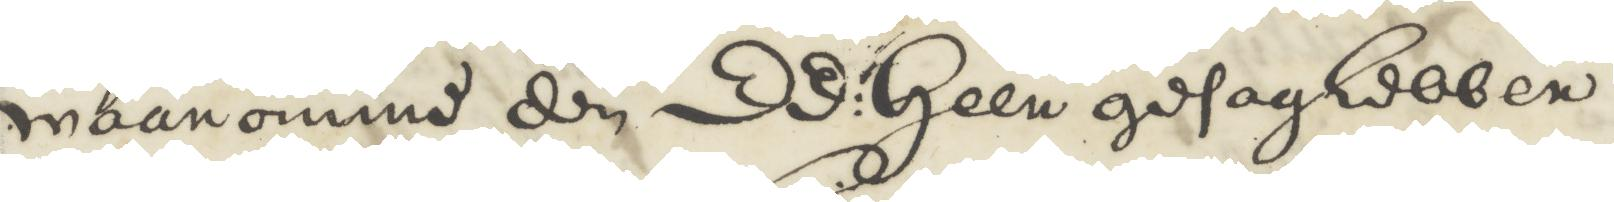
waaromme den EE: Heer gesaghebber
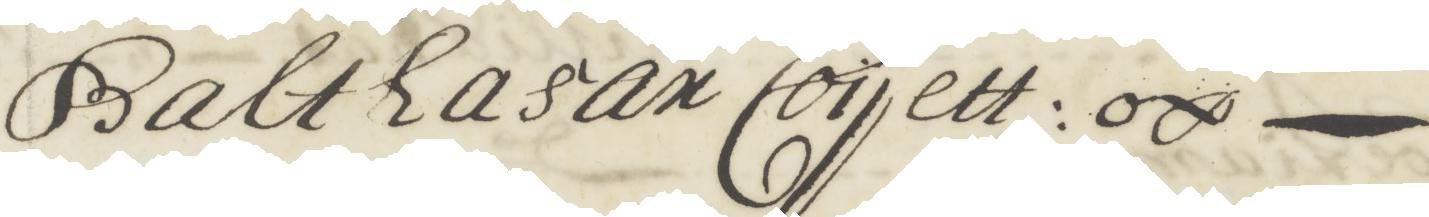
Balthasar Coij ett: op —
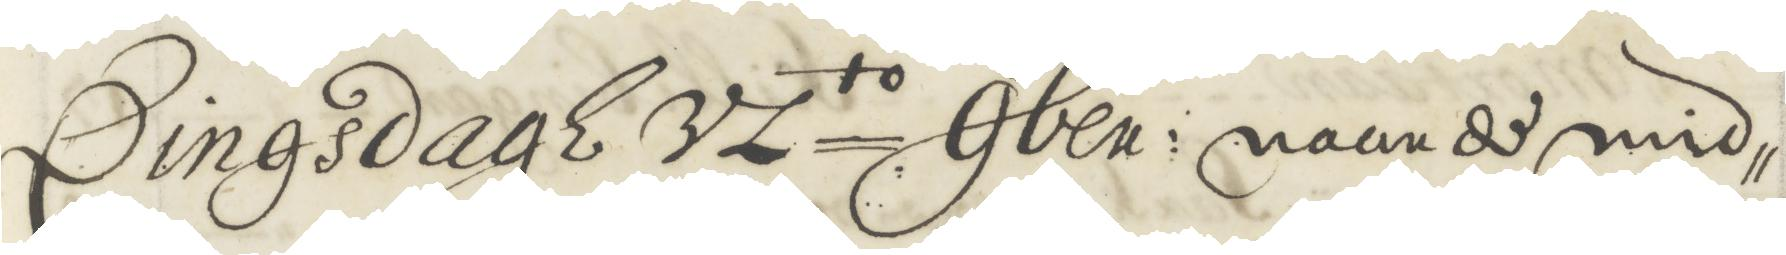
Dingsdagh Vl=to gber: naar de mid„
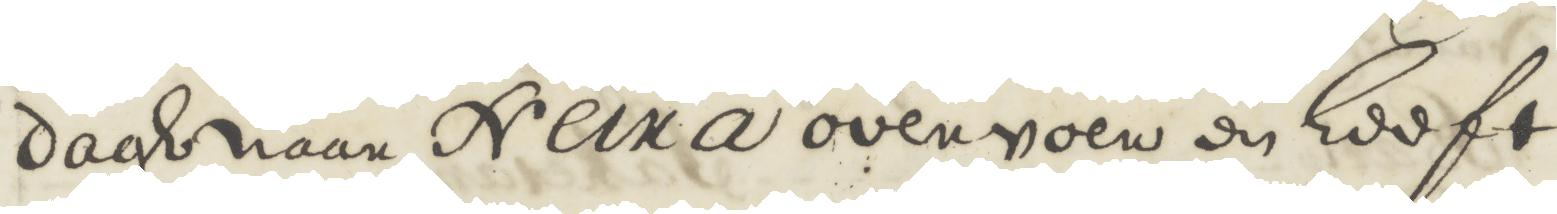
dagh naar Neira overvoer en heeft
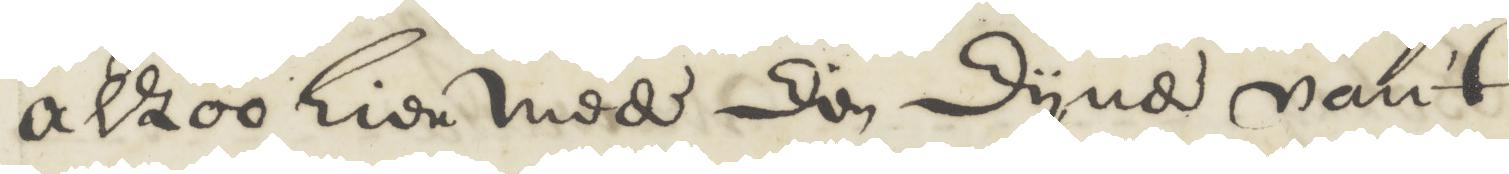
alzoo hier mede Een Eijnde van ’t
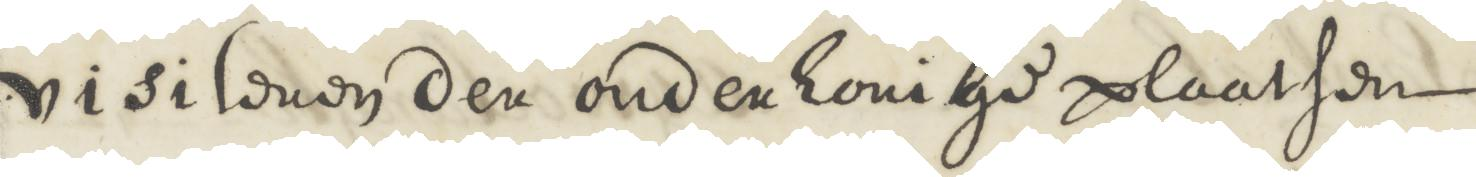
visiteren der onderhorige plaatsen
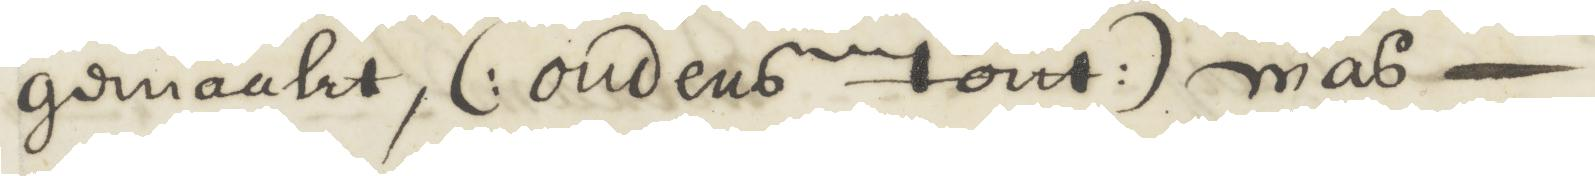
gemaakt, (:onderstont:) was —
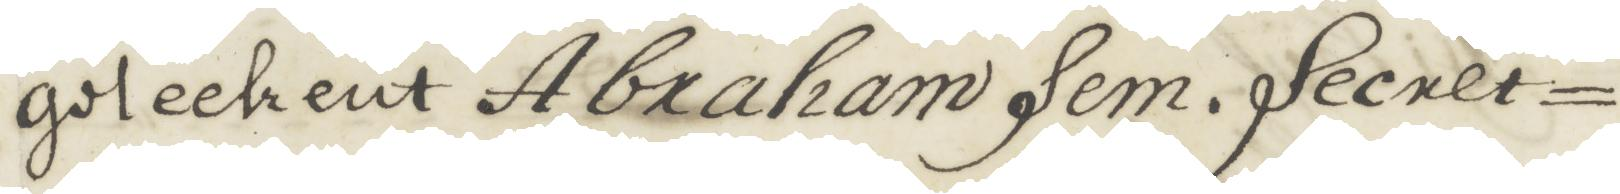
geteekent Abraham Sem. Secret=ris
